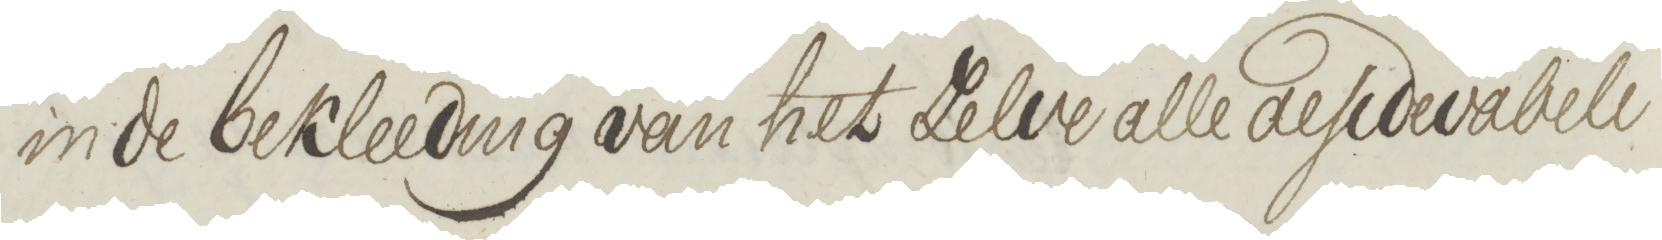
in de bekleeding van het zelve alle desiderabele
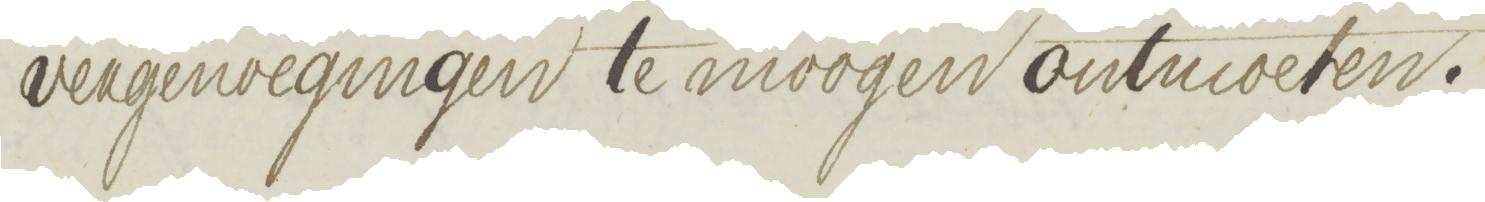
vergenoegingen te moogen ontmoeten.
